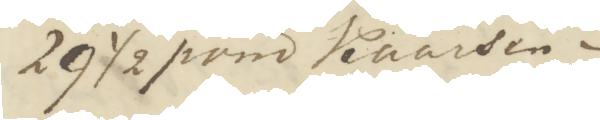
29½ pond kaarsen
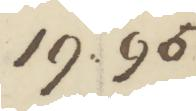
19:96
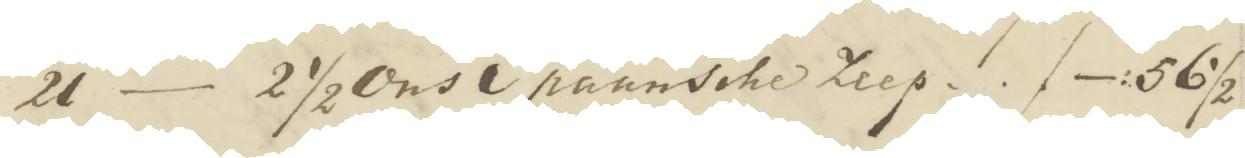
21 — 2½ Ons Spaansche Zeep . . ƒ —:56½
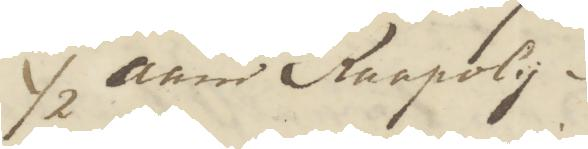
½ aam Raapolij
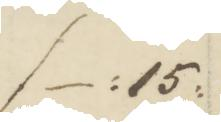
ƒ—:15:
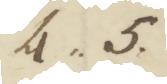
4„ 5.
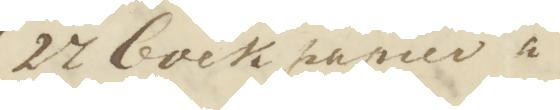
27 boek papier a
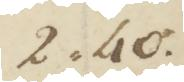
2„ 40.
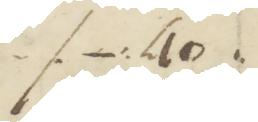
- ƒ —:40 „
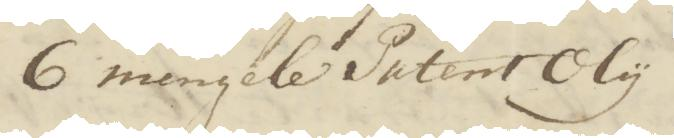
6 mengele Patent Olij
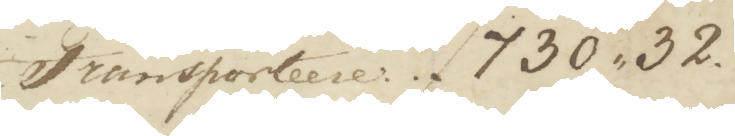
Transporteere... ƒ 730 „32.
